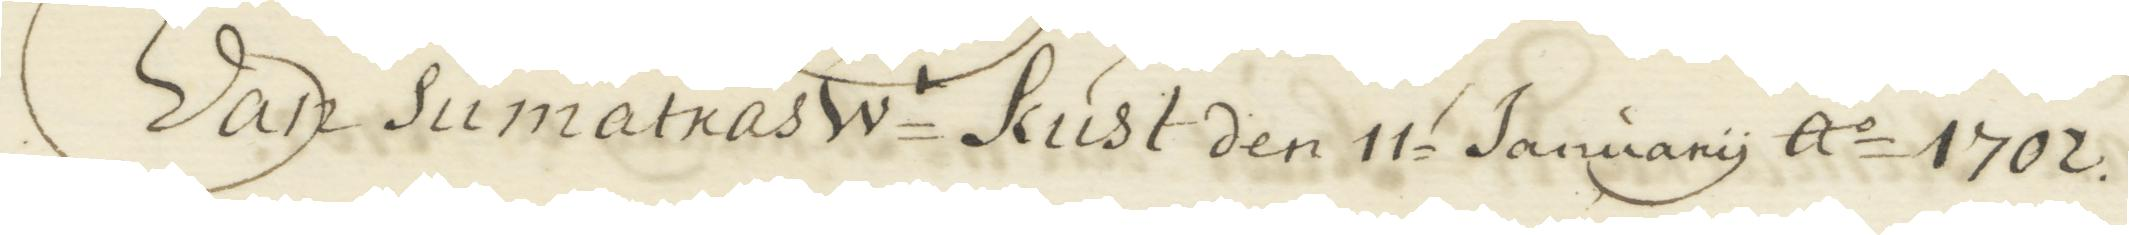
Van Sumatras W=t Kust den 11.' Ianuarij A=o 1702:
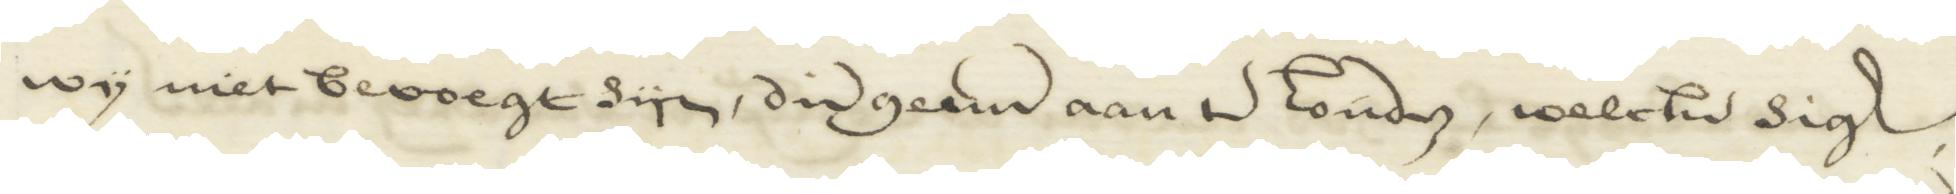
wij niet bevoegt sijn, die geene aan te houden, welcke sigh
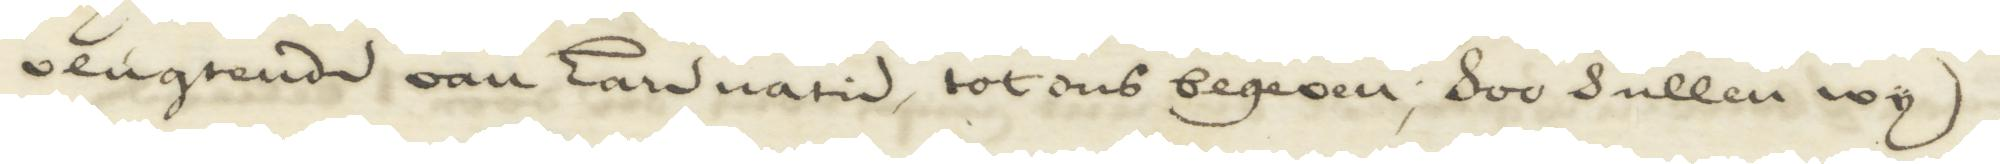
vlugtende van hare natie, tot ons begeven; soo sullen wij
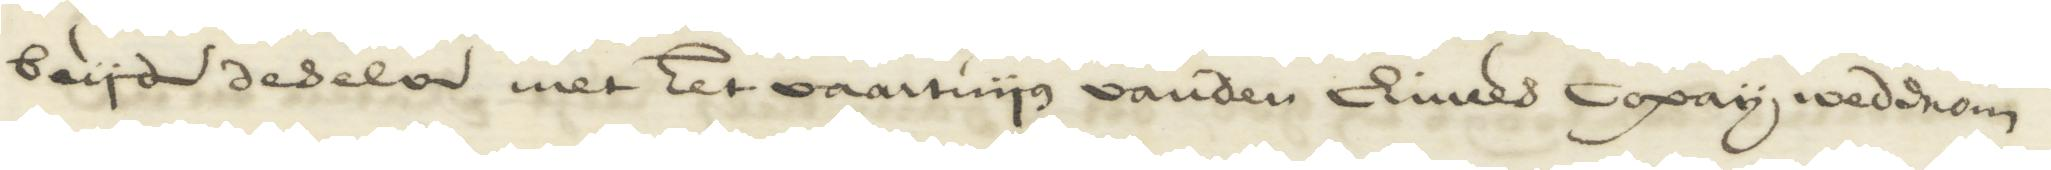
beijde deselve met het vaartuijg van den chinees Copaij wederom
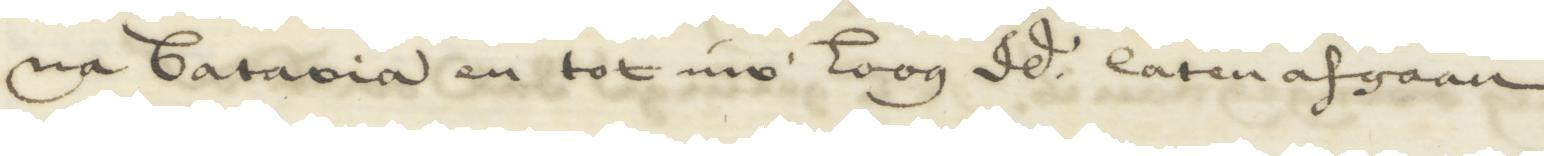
na batavia en tot uw hoog Ed. laten afgaan
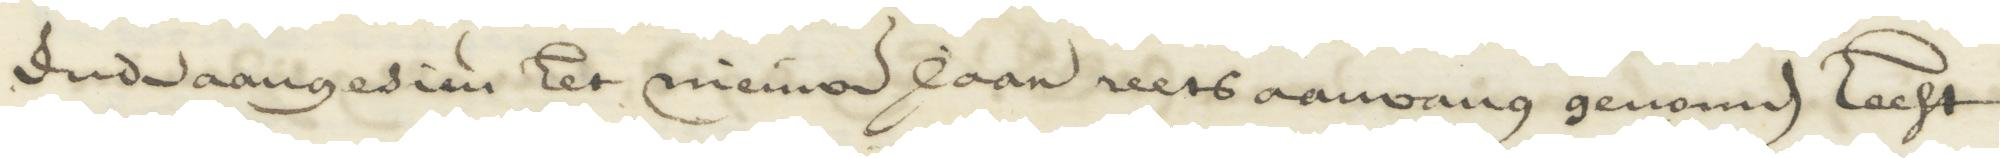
Ende aangesien het nieuwe Jaar reets aanvang genomen heeft
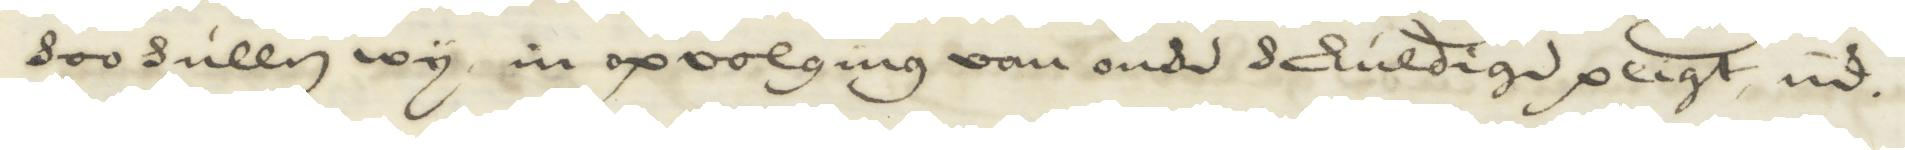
soo sullen wij in opvolging van onse schuldige pligt, uE.
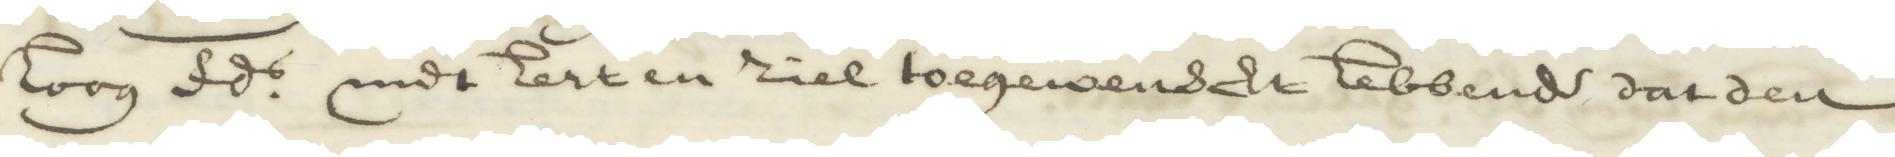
hoog Ed:s met hert en ziel toegewenscht hebbende dat den
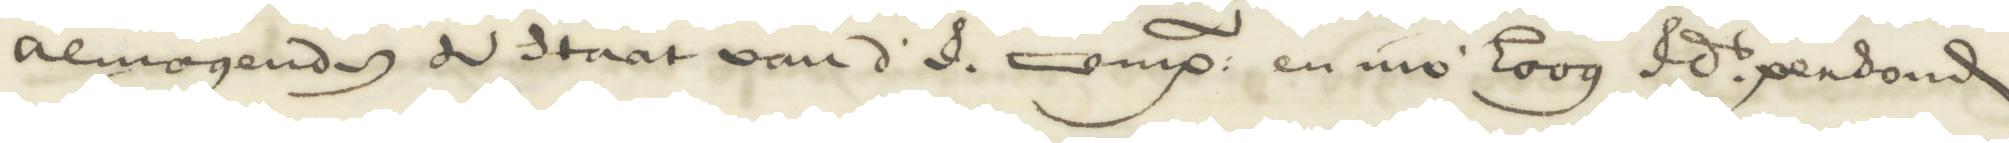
almogenden de staat van d’ E. comp: en uw hoog Ed:s personen
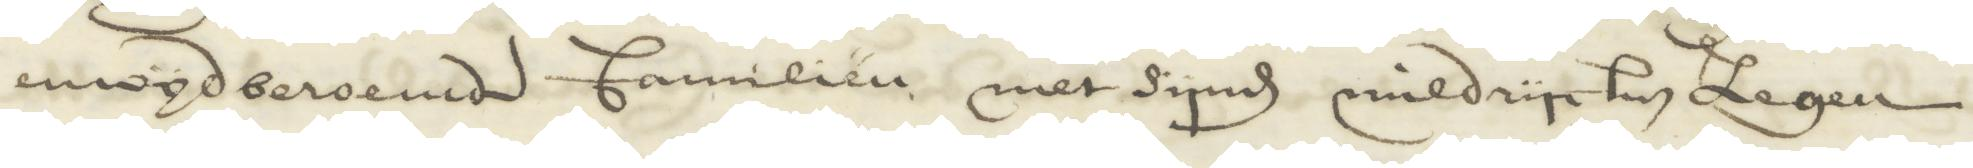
en wijd beroemde familien met sijnen mildrijcken zegen
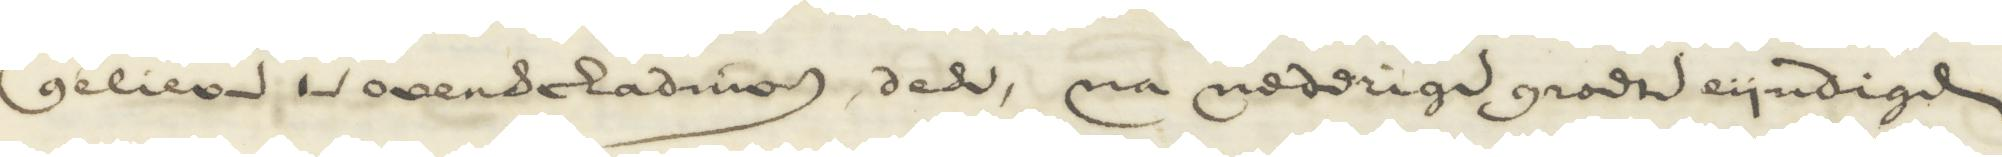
gelieve te overschaduwen, dese, na nederige groete eijndigen
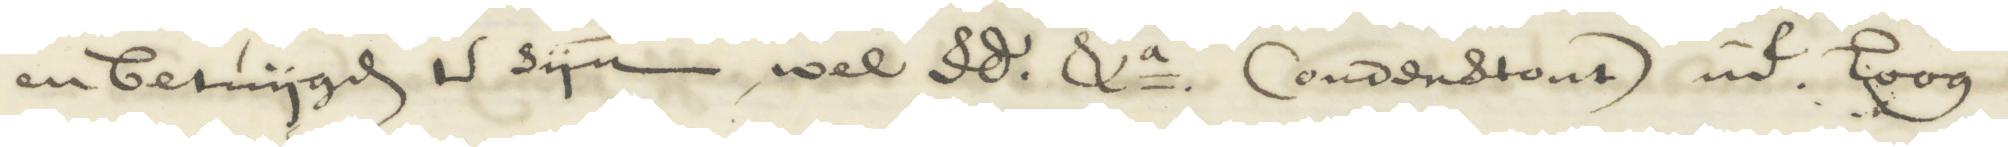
en betuijgen te sijn wel Ed. &=a. (onderstont) uE. hoog
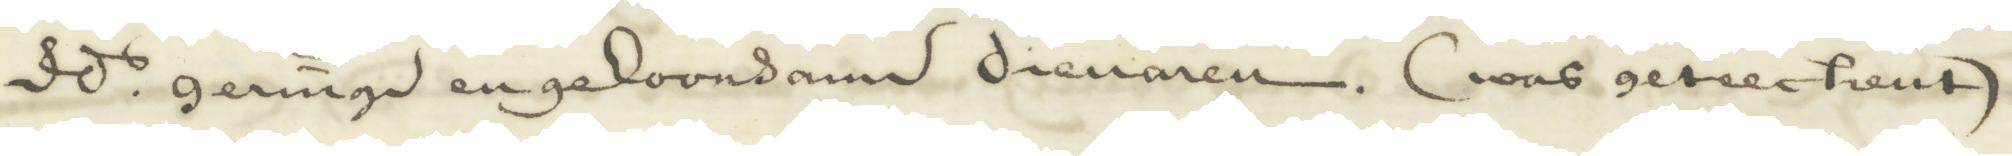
Ed.o geringe en gehoorsame dienaren. (was geteeckent)
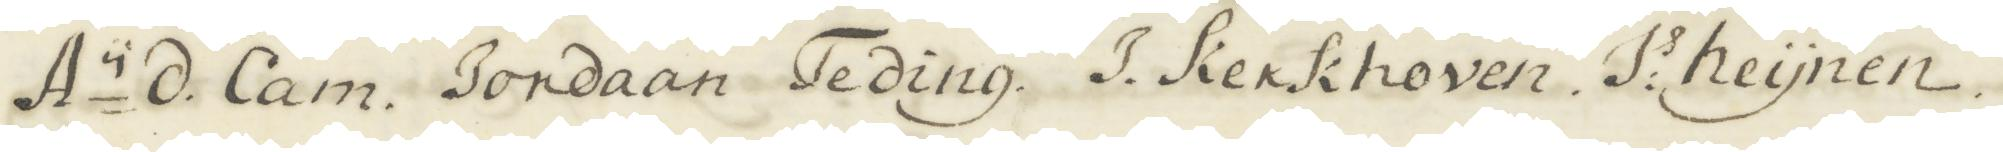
A=ij d. Cam. Iordaan Teding. I. kerkhoven. I:s heijnen.
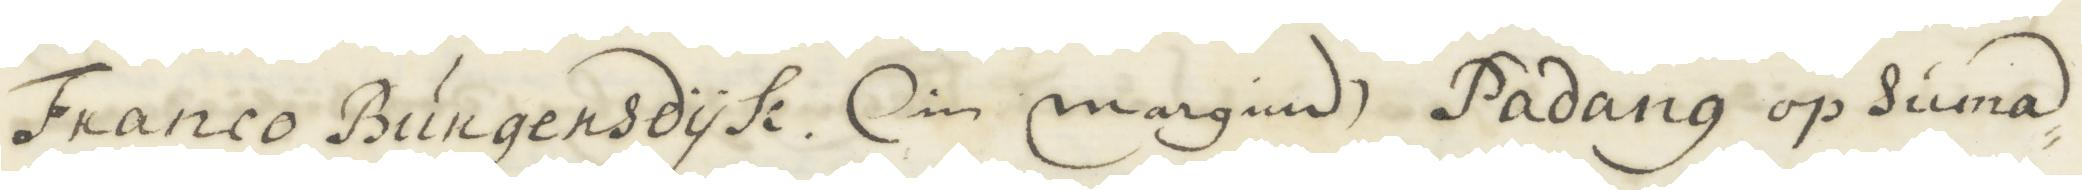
Franco Burgersdijk. (in margine), Padang op Suma„
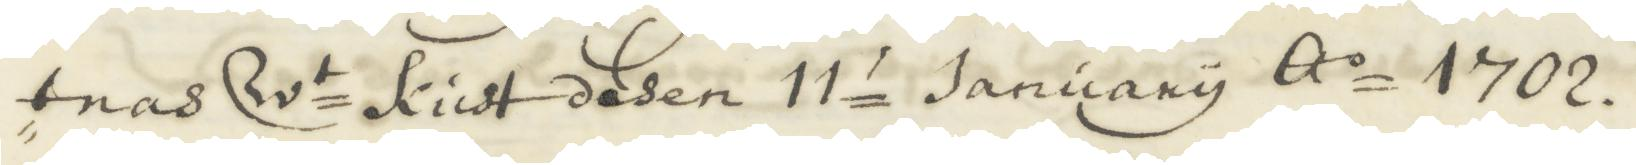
„tras W=t kust desen 11=' Januarij A=o 1702.
